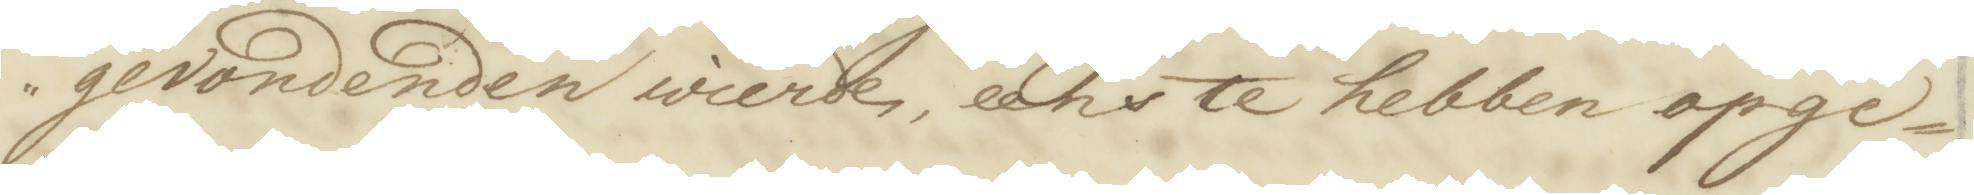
„gevondenden wierde, eens te hebben opge=
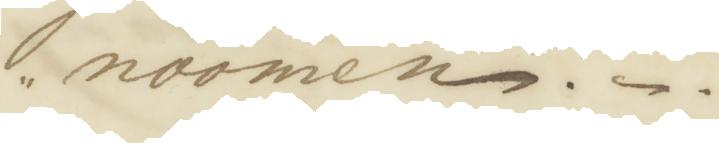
„noomen.-
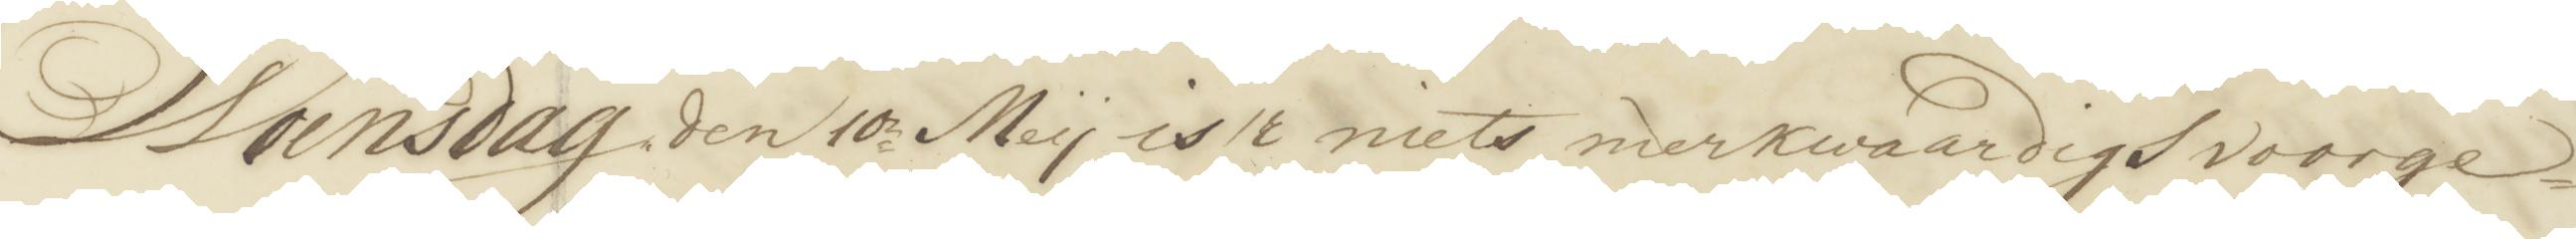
Woensdag „ den 10e Meij is 'r niets merkwaardigs voorge=
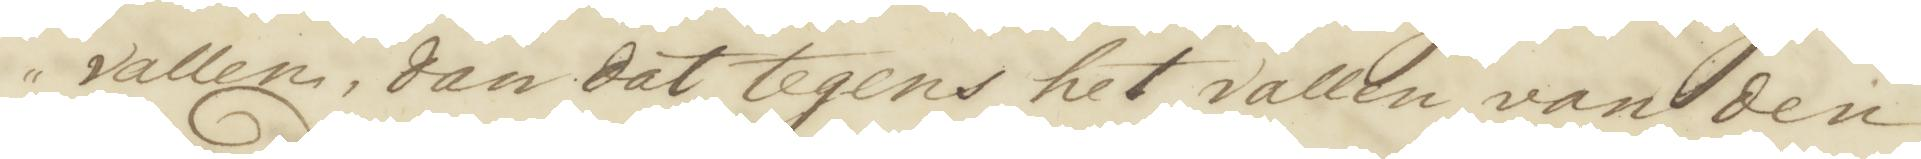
„ vallen, dan dat tegens het vallen van den
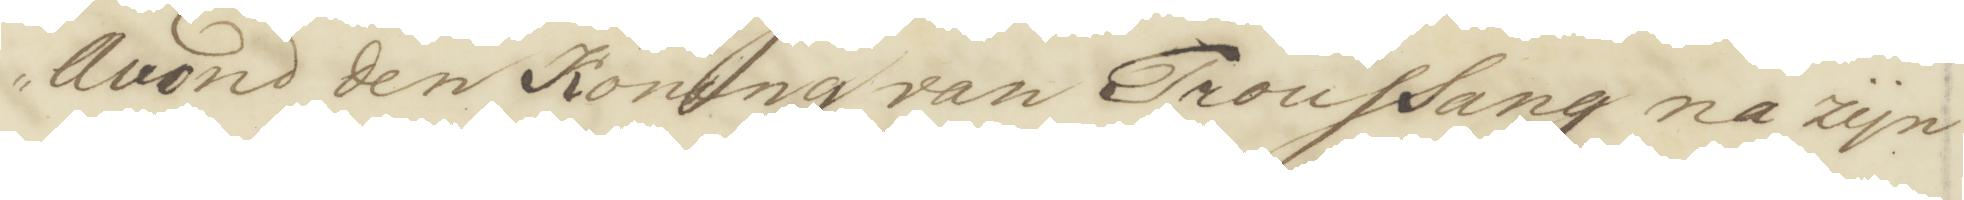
„ Avond den Koning van Troussang na zijn
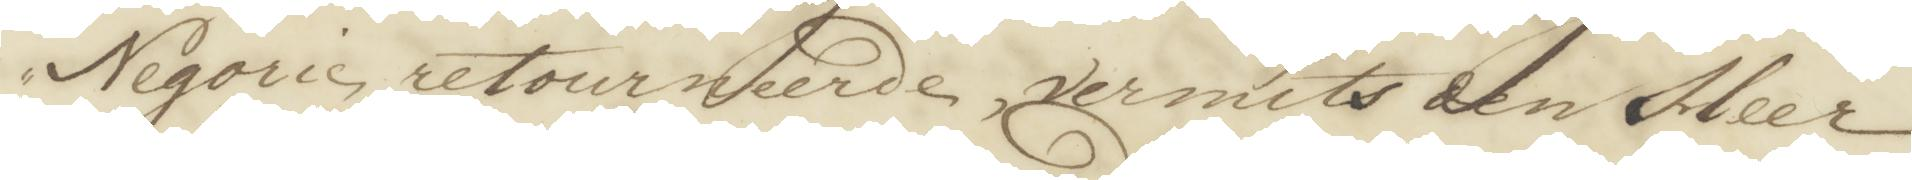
„ Negorie retourneerde vermits den Heer
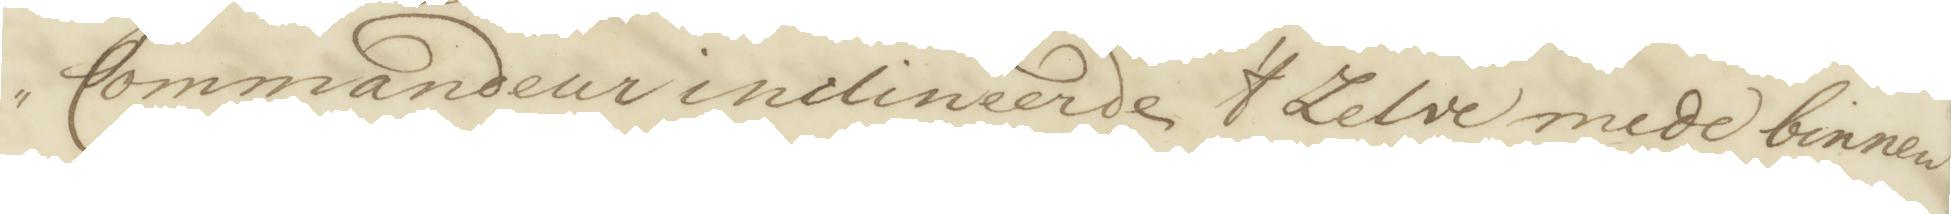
„ Commandeur inclineerde 't zelve mede binnen
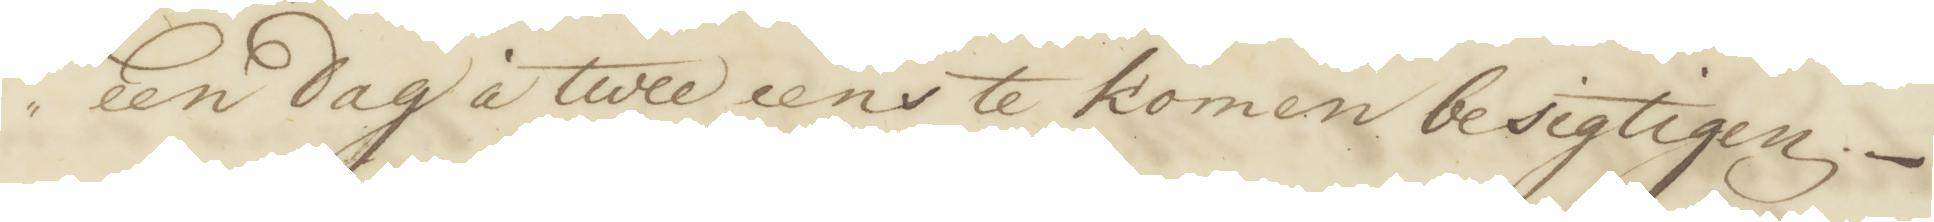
„ een dag à twee eens te komen besigtigen. —
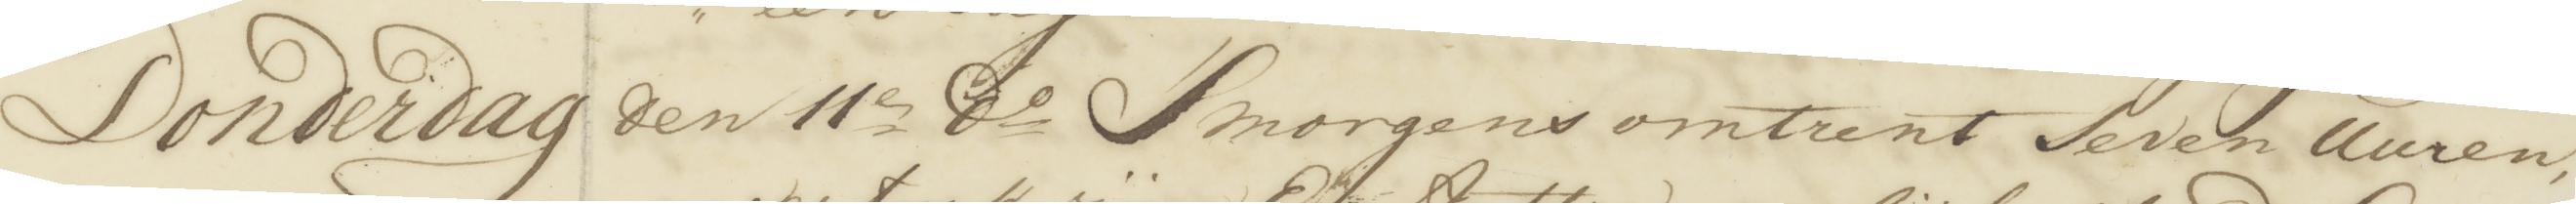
Donderdag den 11=en d=o 'S morgens omtrent seven Uuren,
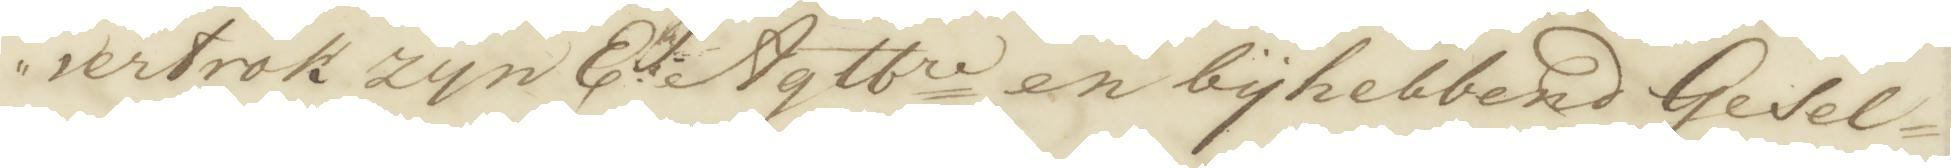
„ vertrok zi jn E: Agtb=re en bij hebbend Gesel=
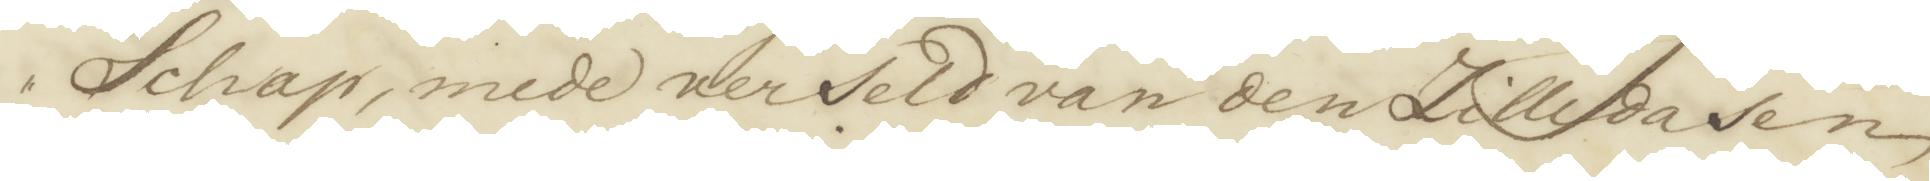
„ schap, mede verseld van den Zillidasen
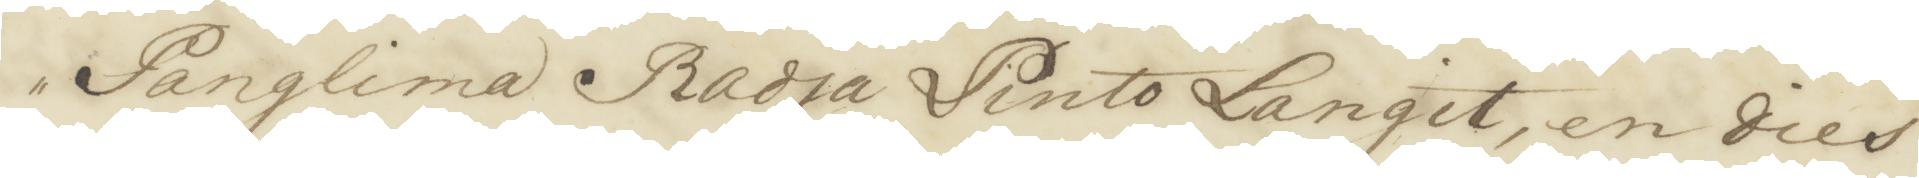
„ Panglima Radja Pinto Langit, en dies
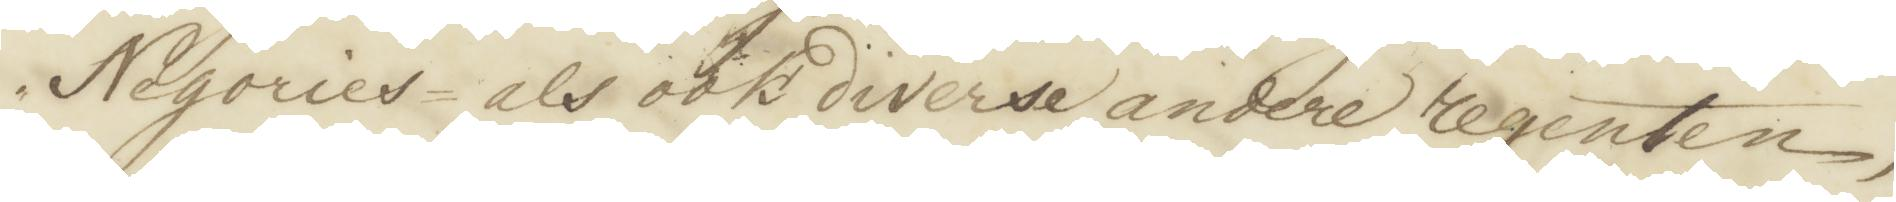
„ Negories= als ook diverse andere regenten,
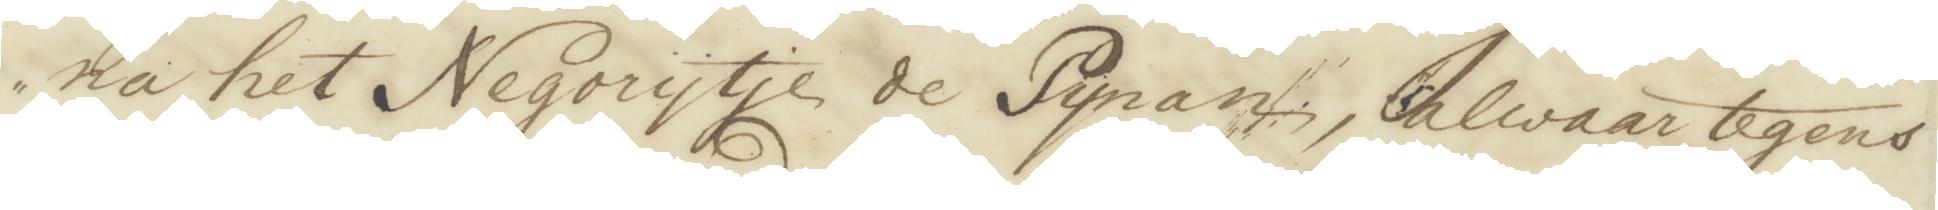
„ na het Negorijtje de Pijnan, alwaar tegens
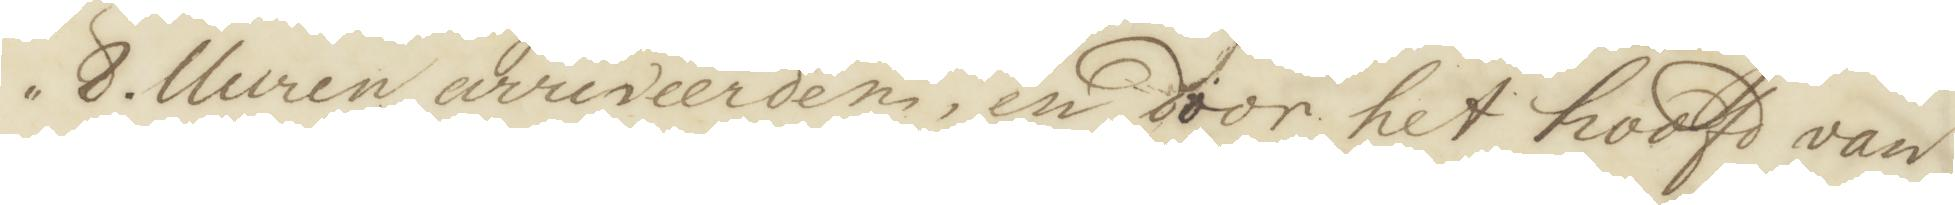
„ 8. Uuren arriveerden, en door het hoofd van
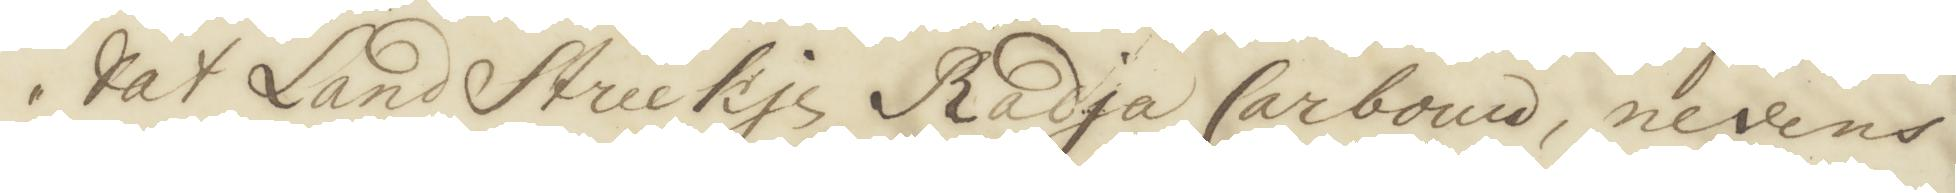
„ dat Land Streekje Radja Carbouw, nevens
